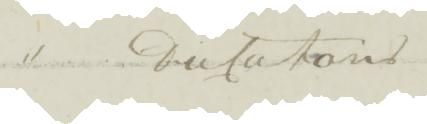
„ ducatons
